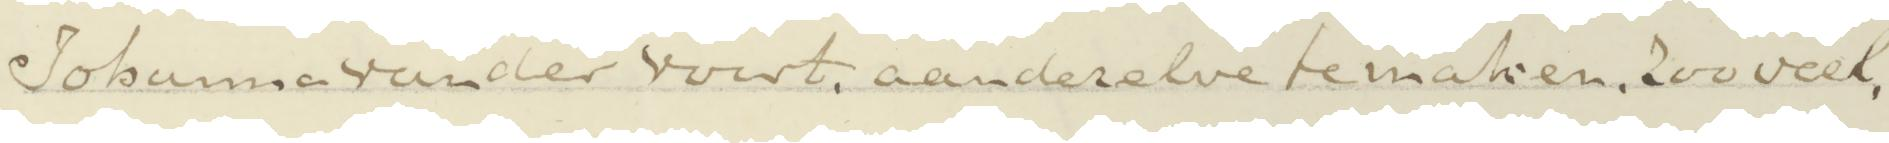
Johanna van der voort, aan dezelve te maken, zoo veel,
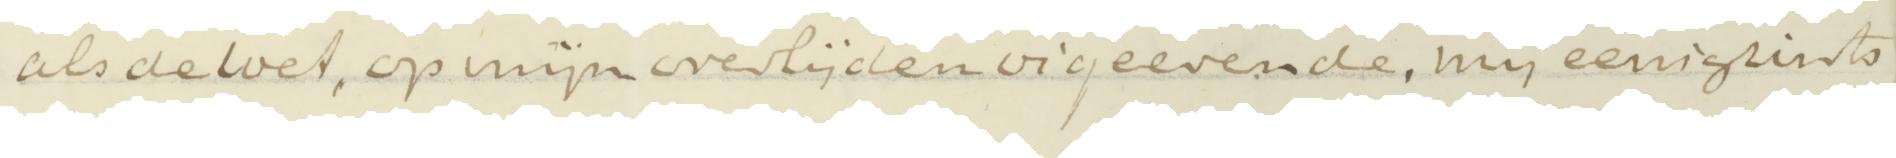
als de wet, op mijn overlijden vigeerende, mij eenigzints
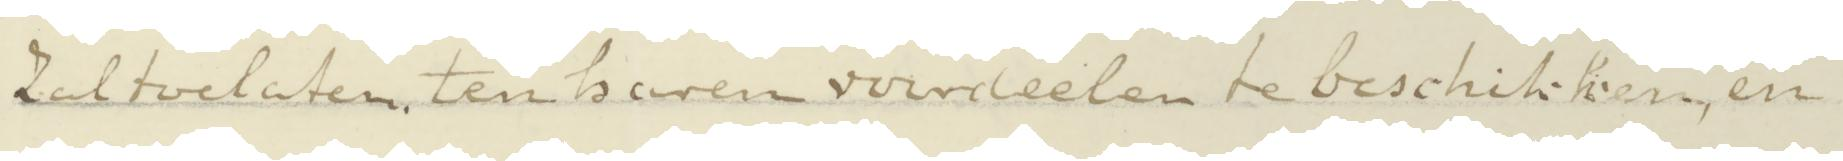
zal toelaten. ten haren voordeelen te beschikken, en
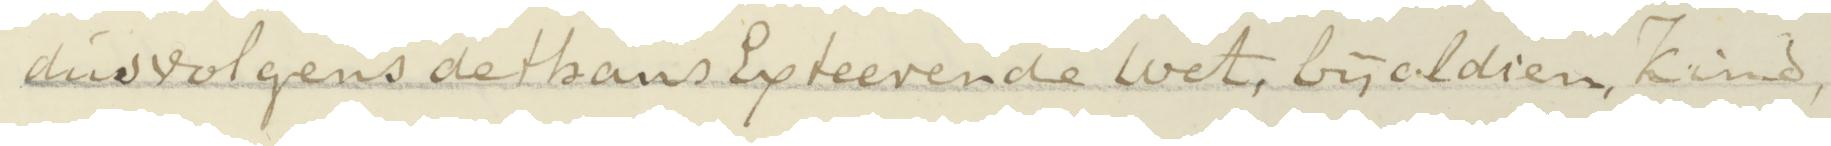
dus volgens de thans Exteerende wet, bij aldien, kind,
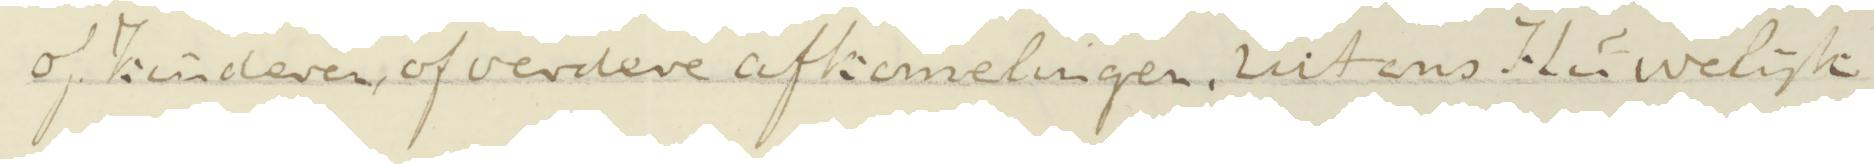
of kinderen, of verdere afkomelingen, uit ons Huwelijk
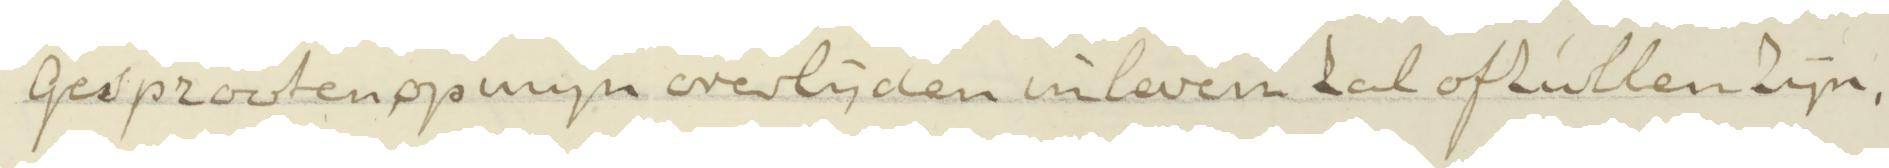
Gesprooten, op myn overlijden in leven zal of zullen zijn,
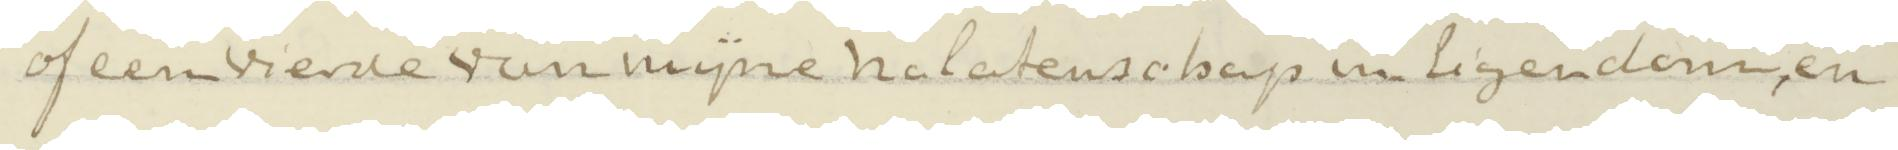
of een vierde van mijne nalatenschap in Eigendom, en
